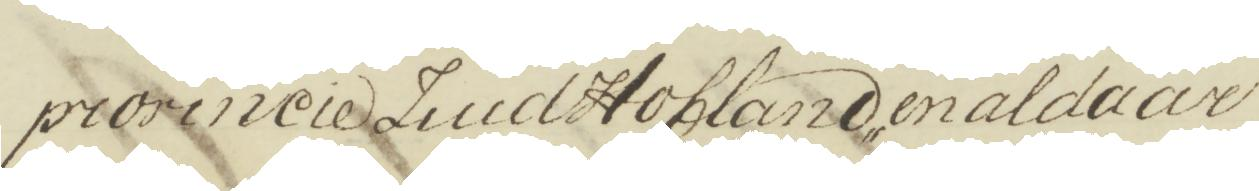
provincie Zuid Holland„ en aldaar
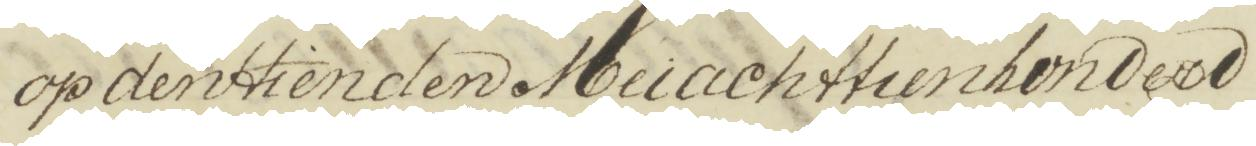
op den tienden Mei achttienhonderd
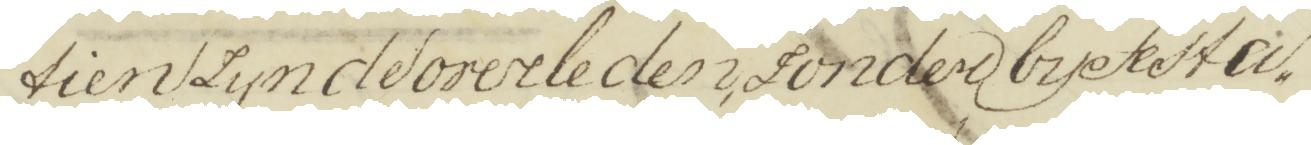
tien zynde overleden, zonderd by Testa„
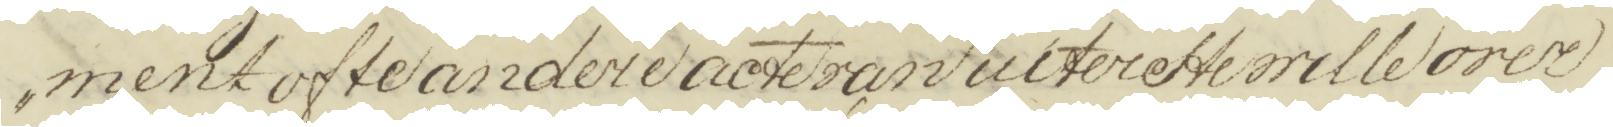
„ment ofte andere acte van uiterste wille over
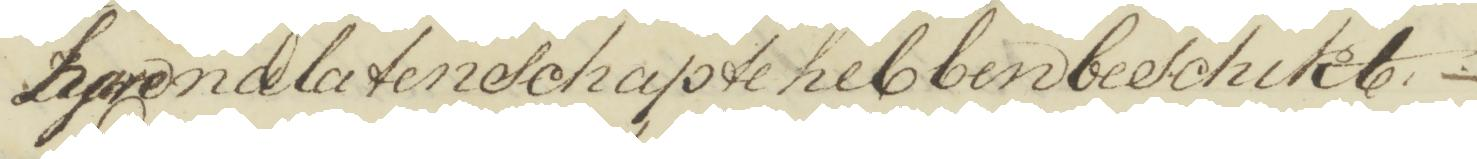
hare nalatenschap te hebben beschikt. —
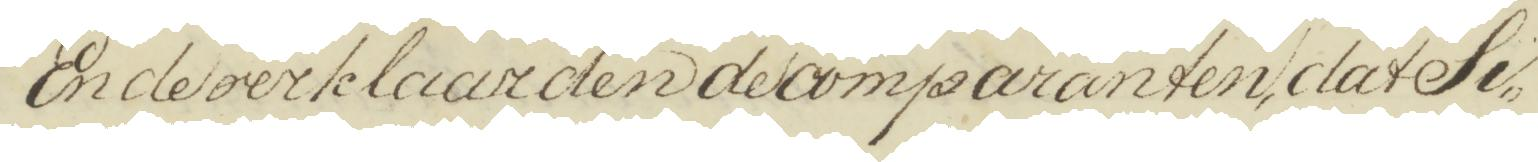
En de verklaarden de comparanten, dat Si„
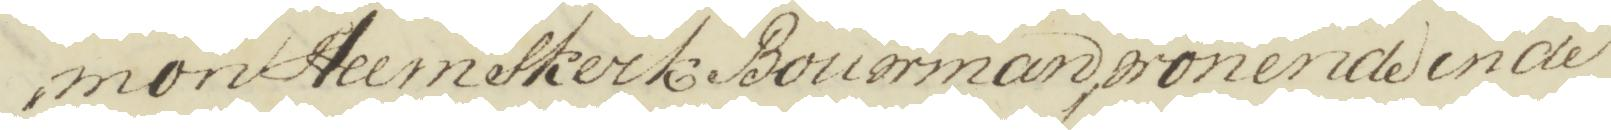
„mon Heemskerk Bouwman, wonende in de
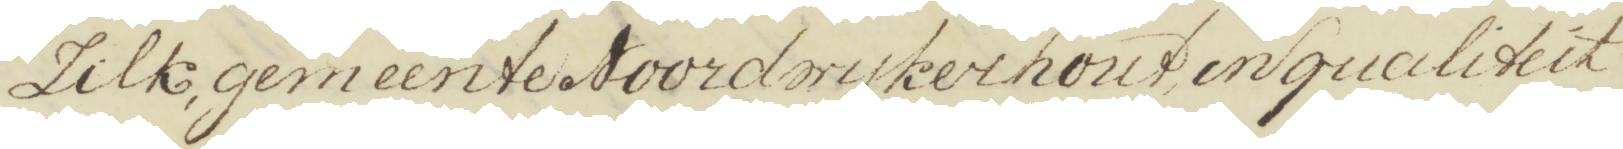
Zilk, gemeente Noordwykerhout, in qualiteit
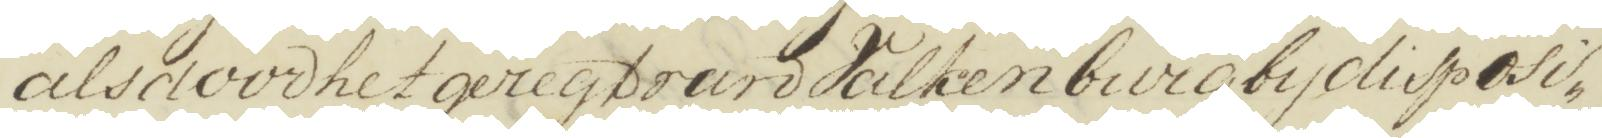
als door het geregt van Valkenburg by disposi„
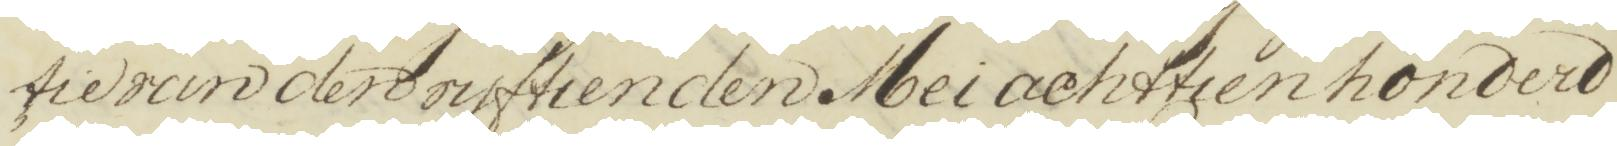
tie van den vyftienden Mei achttien honderd
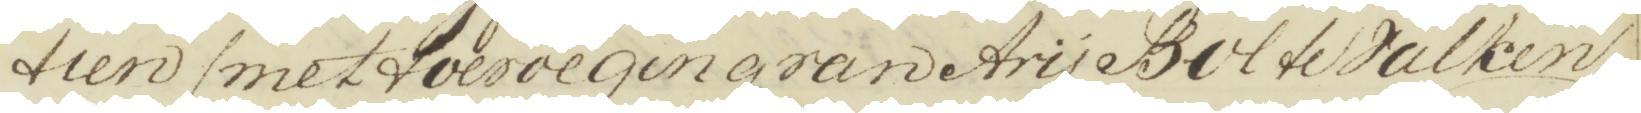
tien (met toevoeging van Arij Bolte Valken
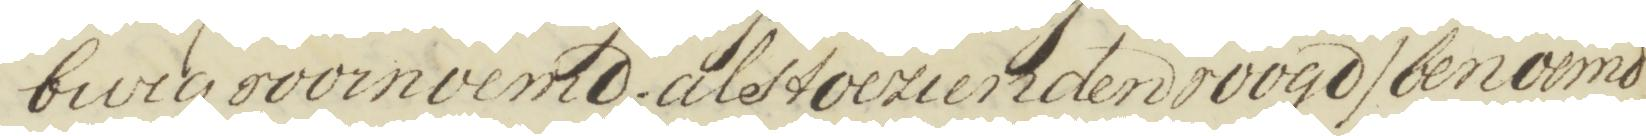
burg voornoemd, als toezienden voogd benoemd
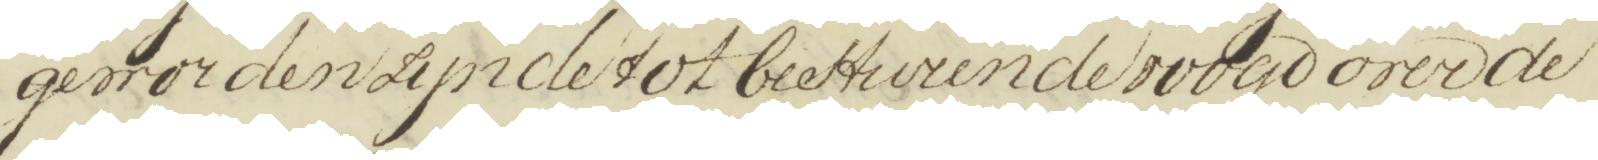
geworden zynde tot besturende voogd over de
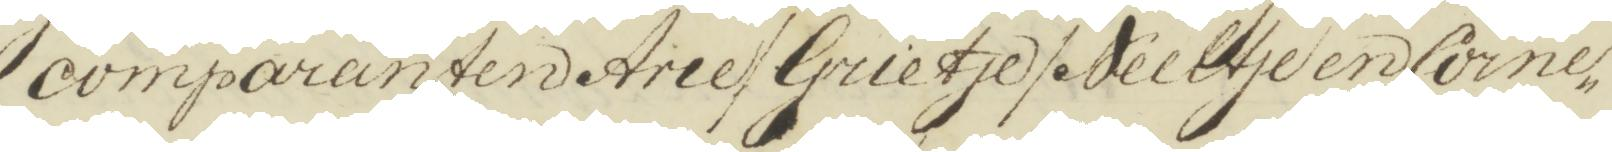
comparanten Arie / Grietje / Neeltje en Corne„
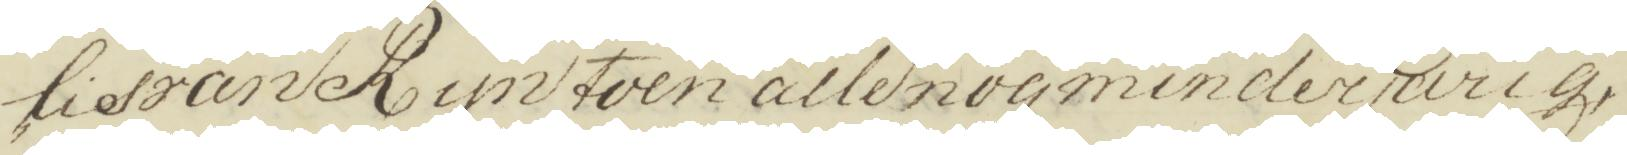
„lis van Ryn, toen alle nog minderjarig,
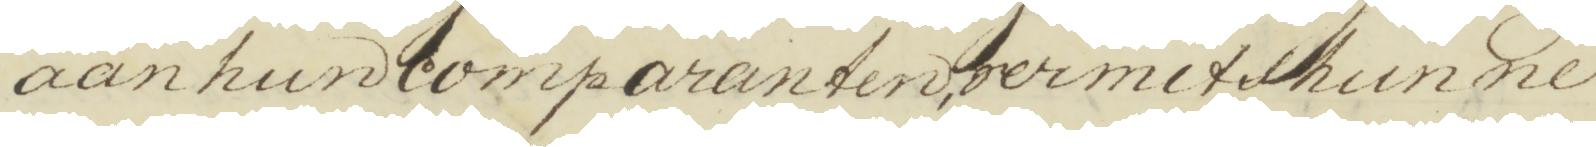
aan hun comparanten, vermits hunne
